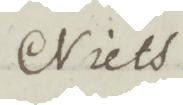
Niets
